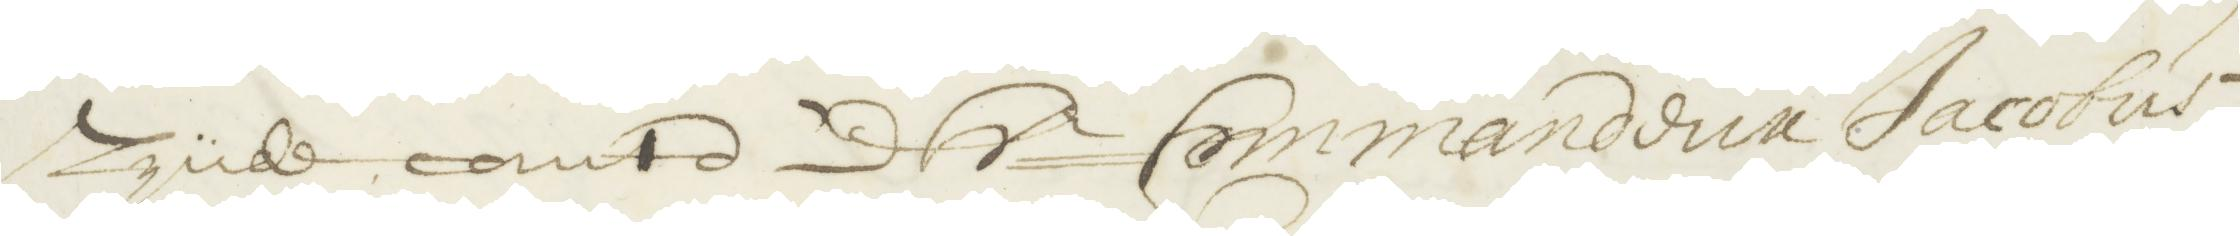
zijnde comt d 'E H=r Commandeur Jacobus
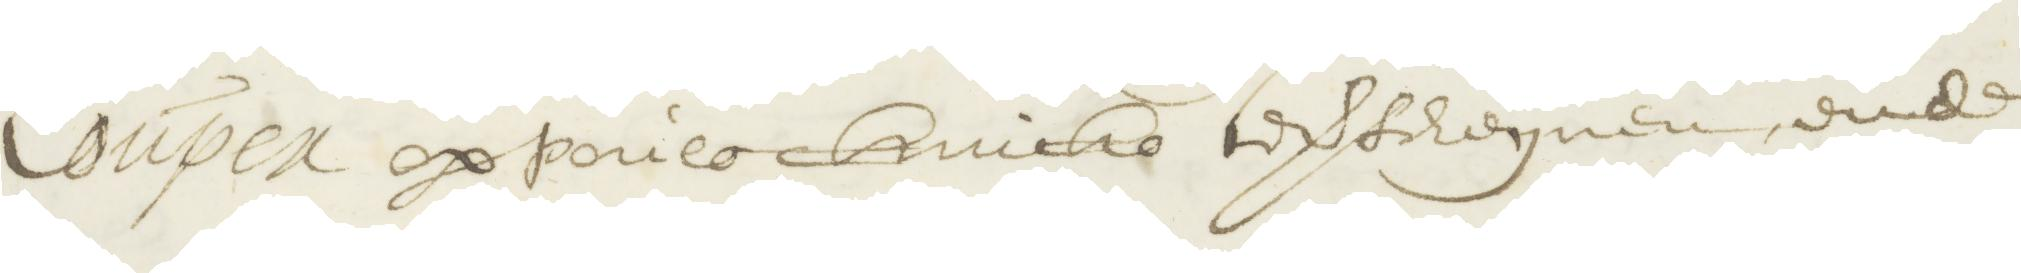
Couper op poulo chincko te verscheijnen, ende
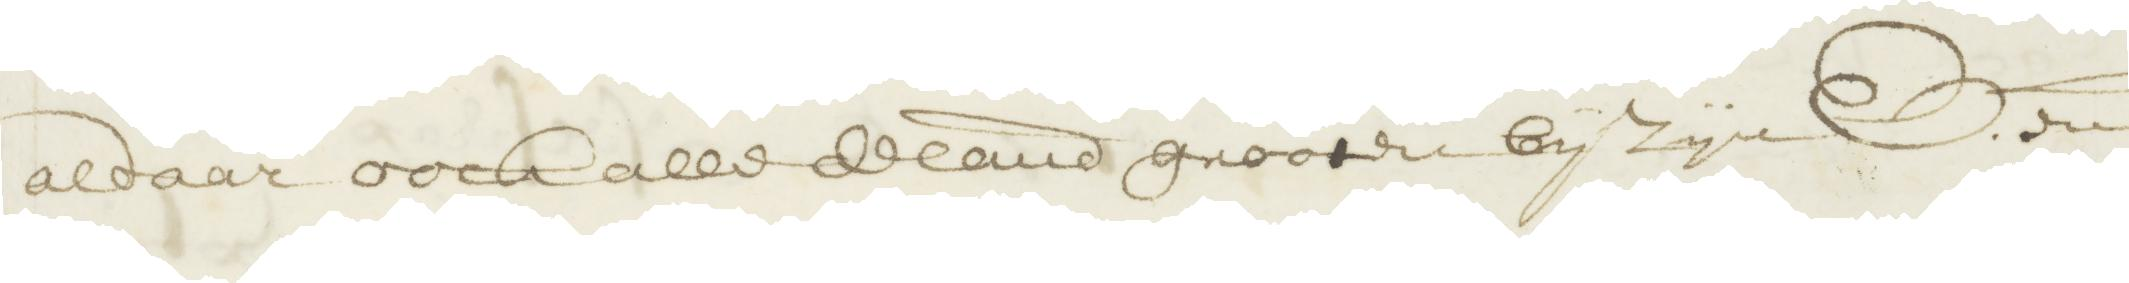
aldaar oock alle de land grooten bij zijn E. en
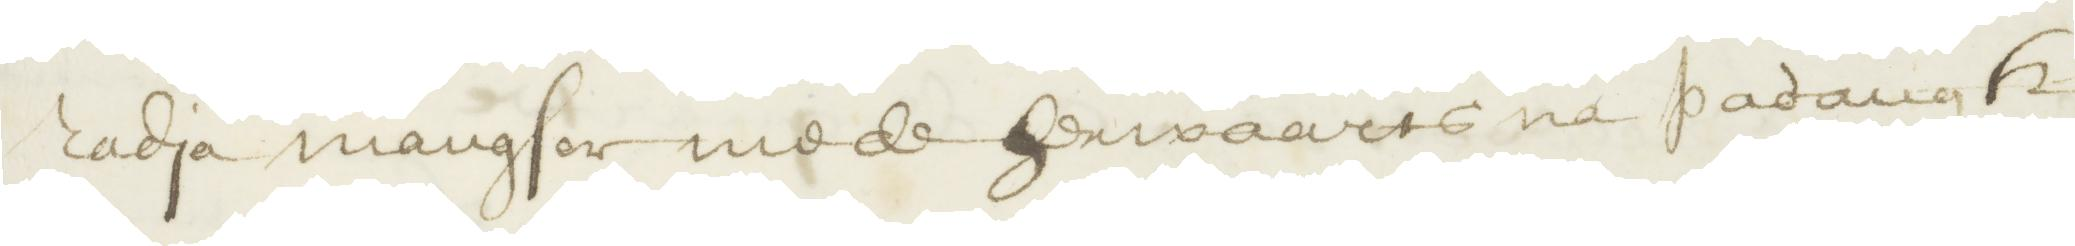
radja mangsor mede herwaarts na padangh
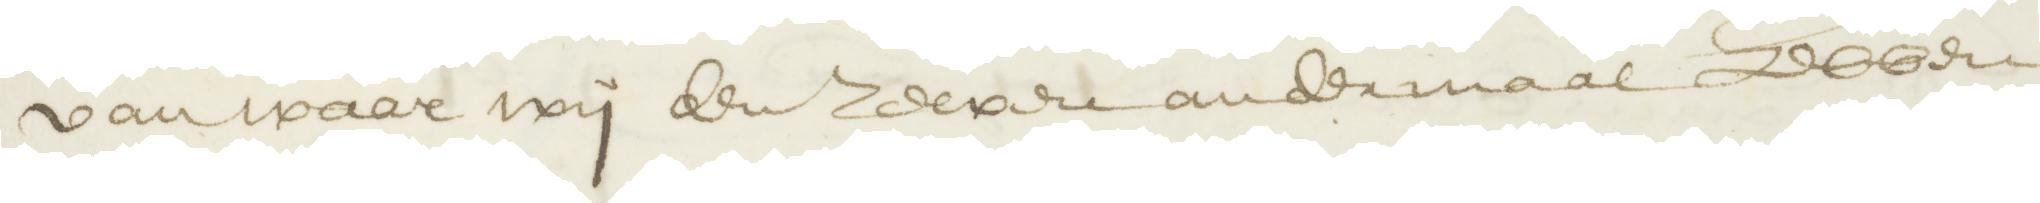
van waar wij den zelven andermaal hebben
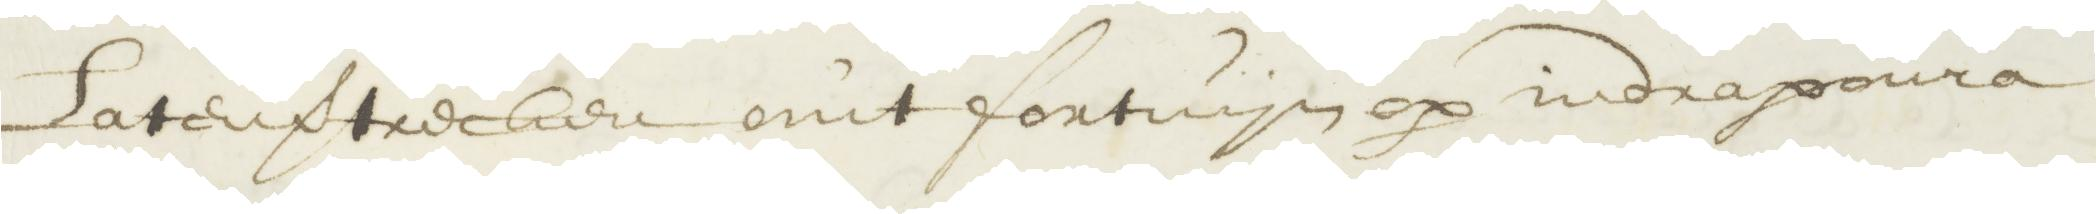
Laten vertrecken om 't fortuijn op indrapoura
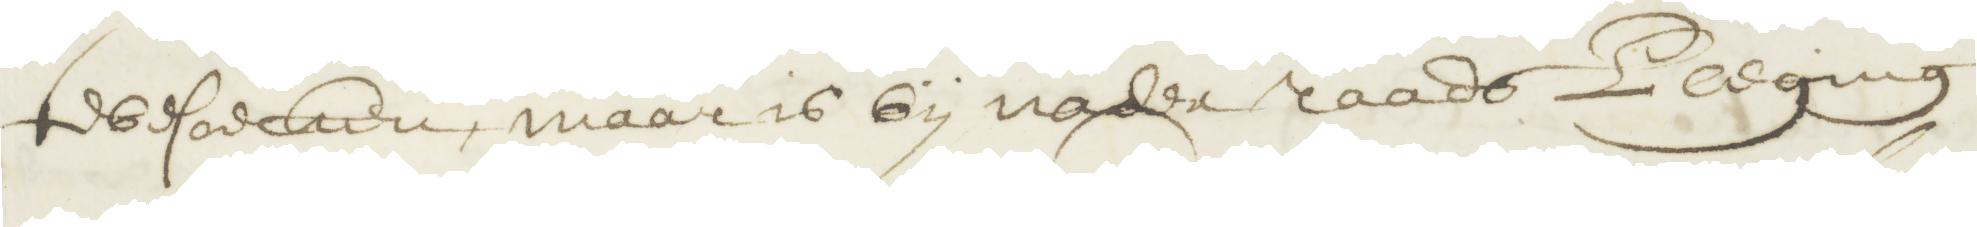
te besoecken, maar is bij nader raads Pleging
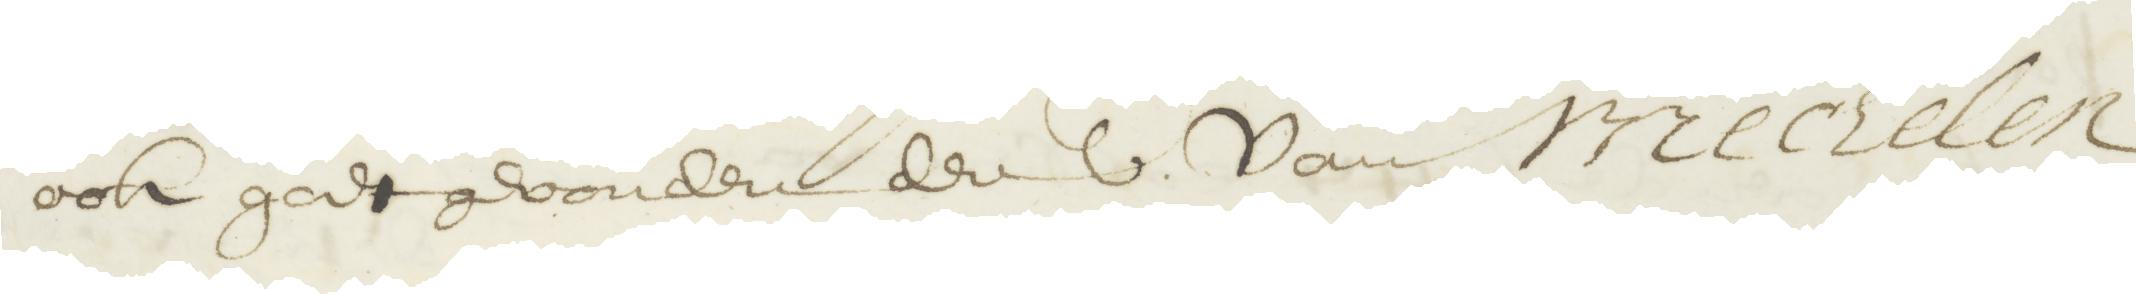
ook goet gevonden den E: Van Mechelen
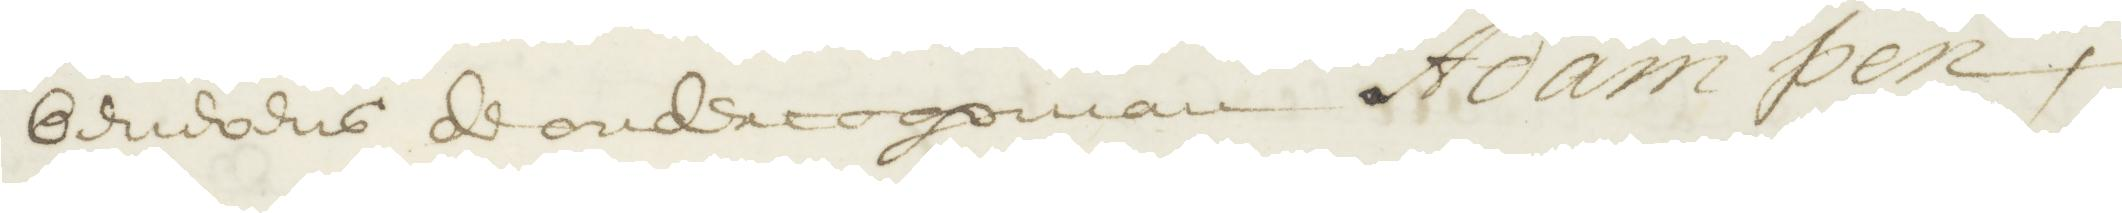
benevens de ondercoopman Adam pen,
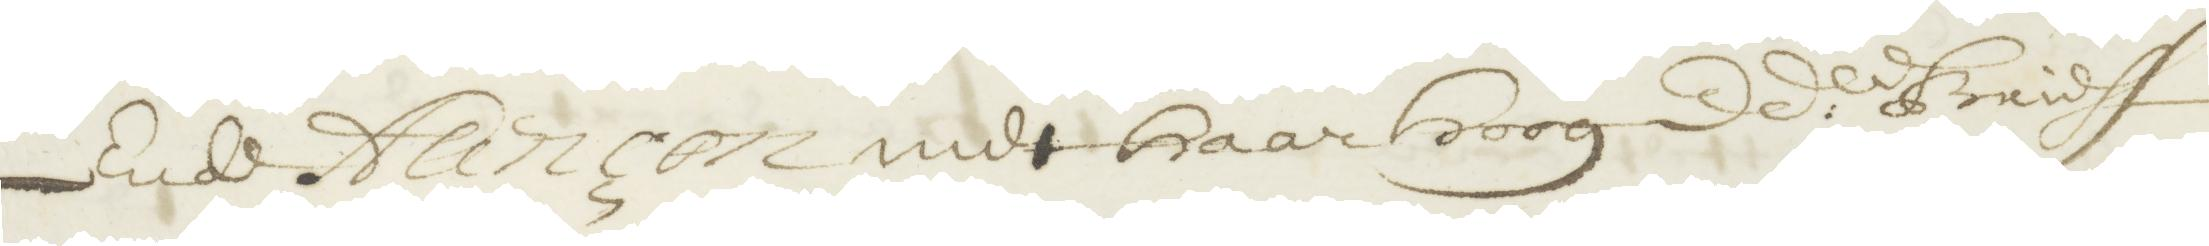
Ende Alençon met haar hoog Ed:le Brieff
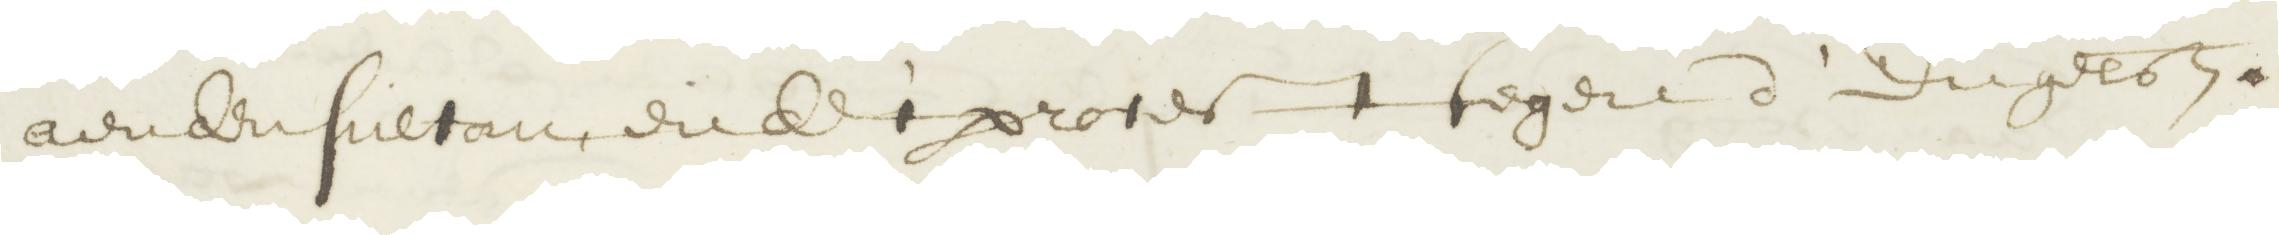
aen den sultan, ende 't protest tegen d’ Engelsz.
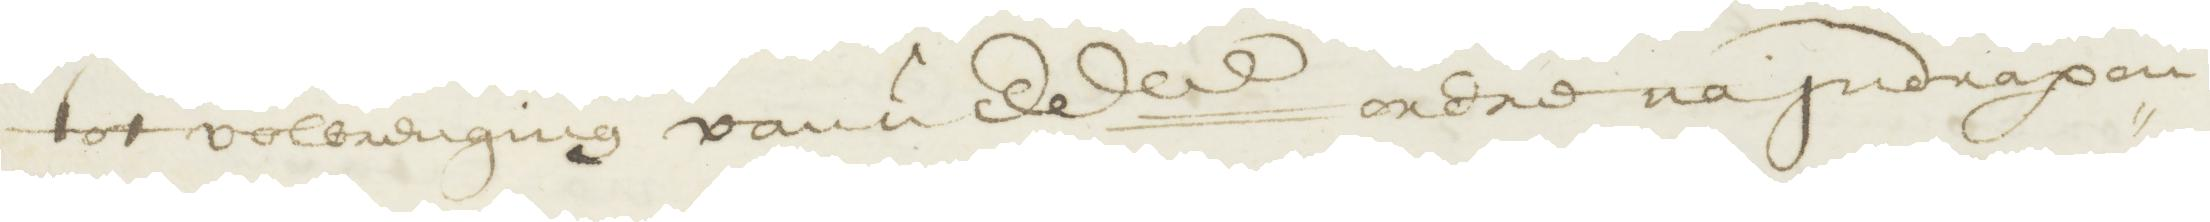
tot volbrenging van u Ed=le ordre na jndrapou„
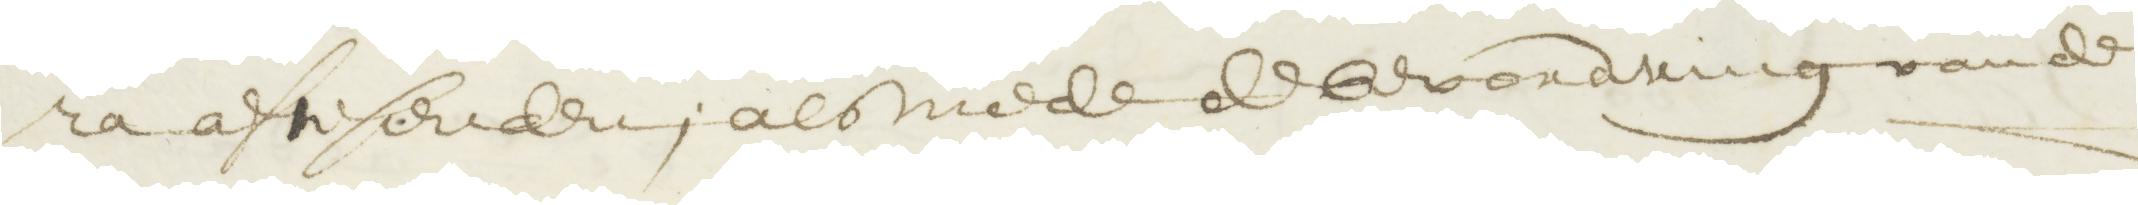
ra aftesenden; alsmede de bevordring van de
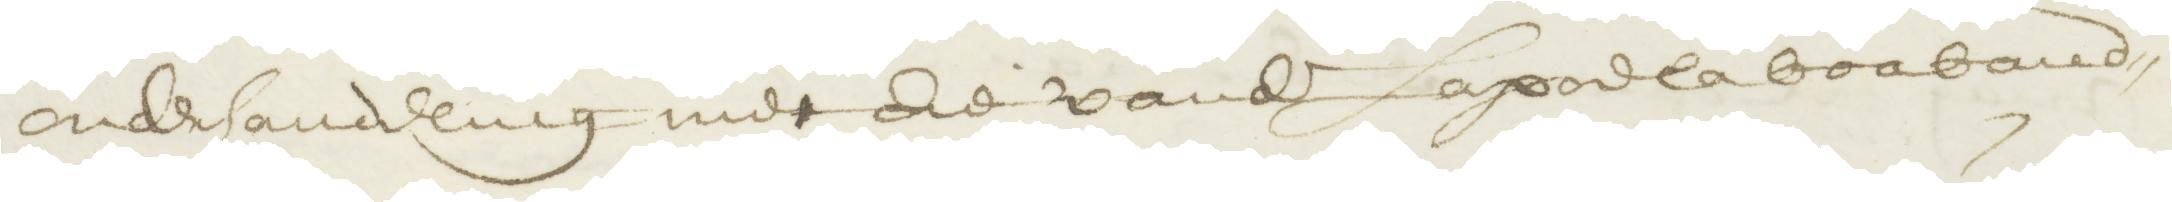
onderhandeling met die van de sapoelaboaband„s
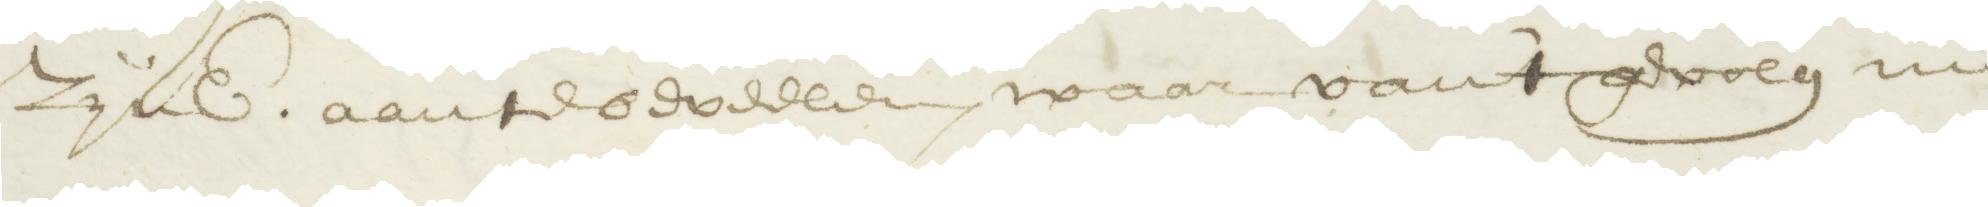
zijn E. aan te beveelen, waar van ’t gevolg nu
